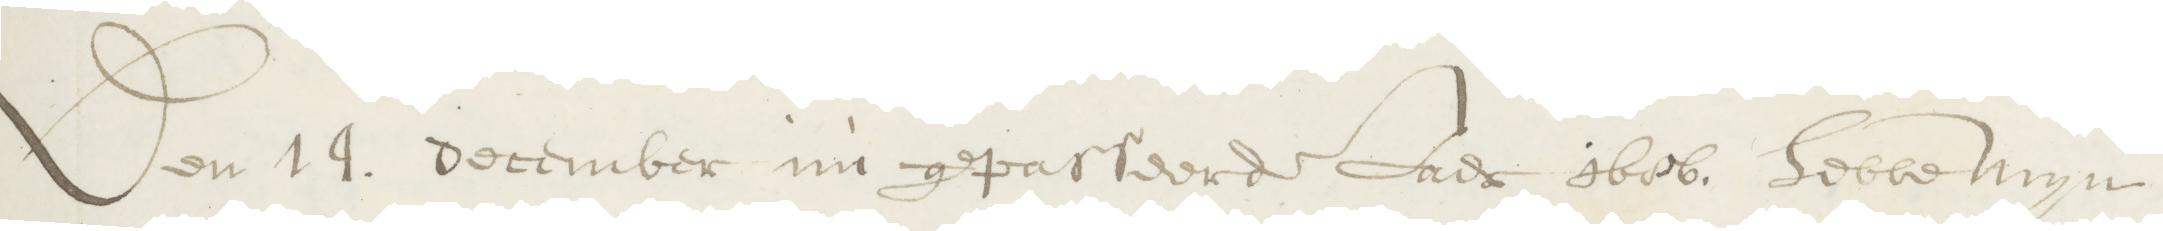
Den 14. december int gepasseerde Iaer 1686. hebbe mijn
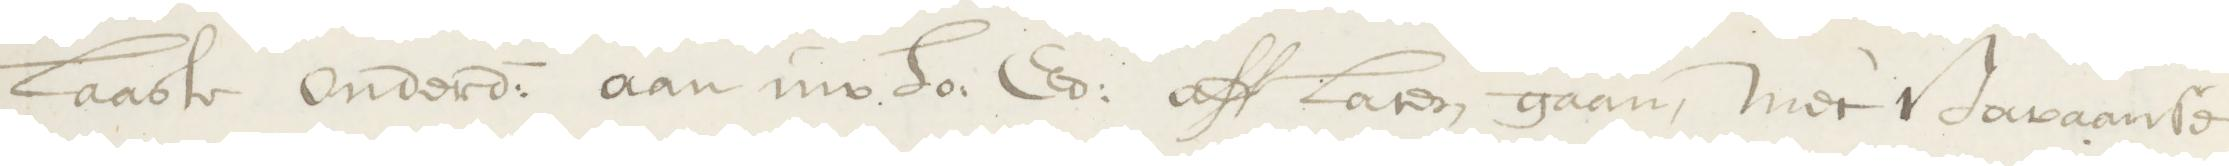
laaste onderd: aan uw ho: Ed: aff laten gaan, met ’t Iavaanse
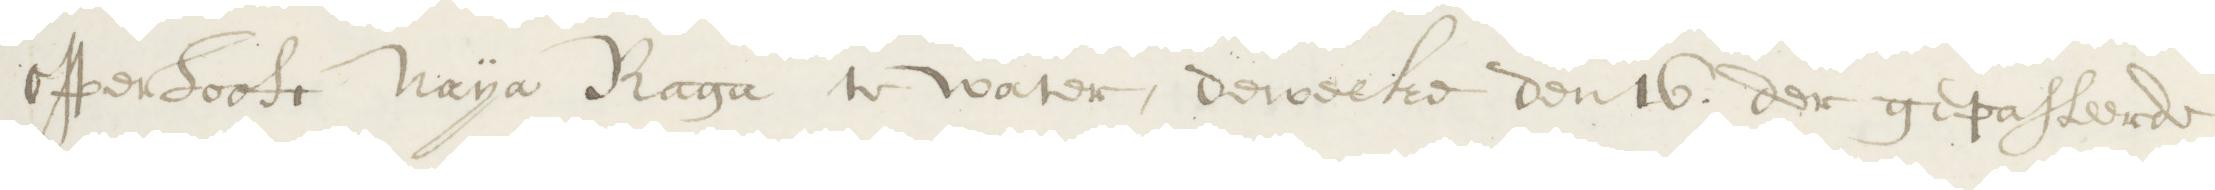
opperhooft Naija Raga te water, dewelke den 16. der gepasseerde
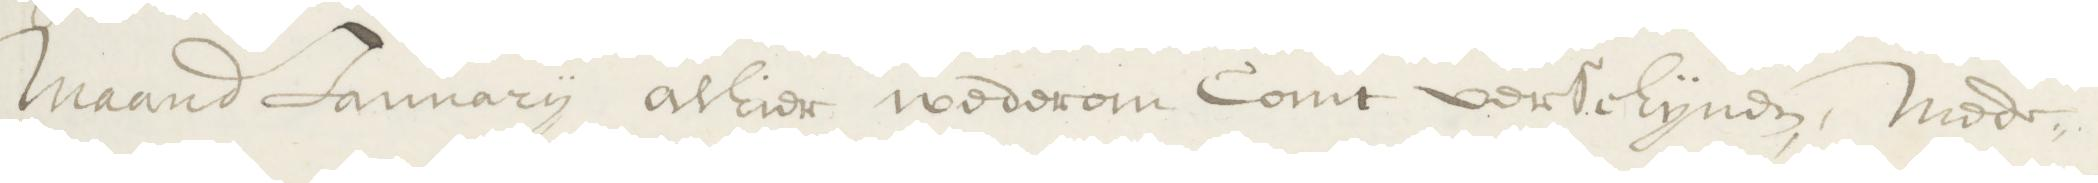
maand Ianuarij alhier wederom Comt verschijnen, mede„
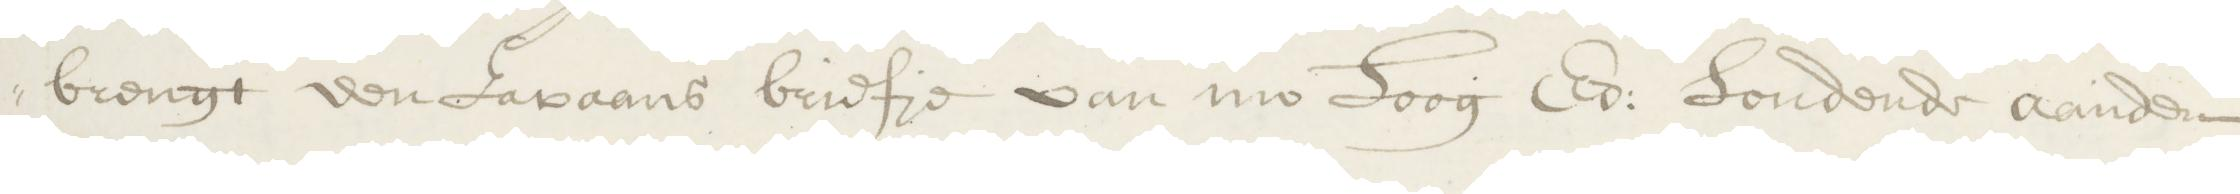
„brengt een Iavaans briefje van uw Hoog Ed: soudende aanden
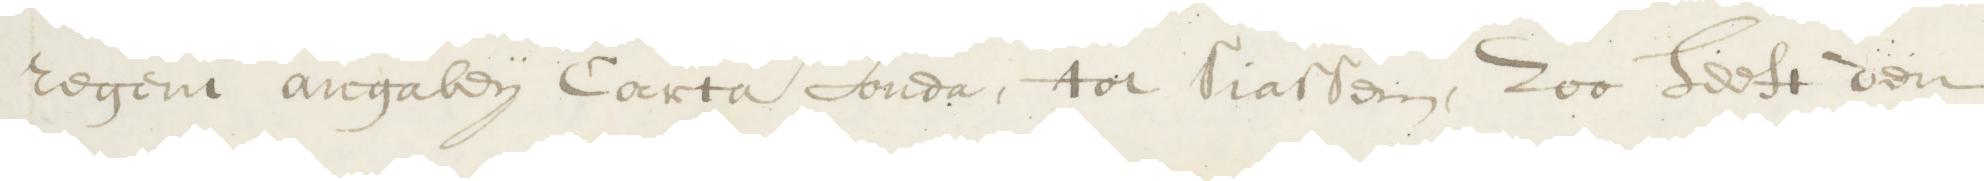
regent angabeij Carta Iouda, tot siassem, zoo heeft den
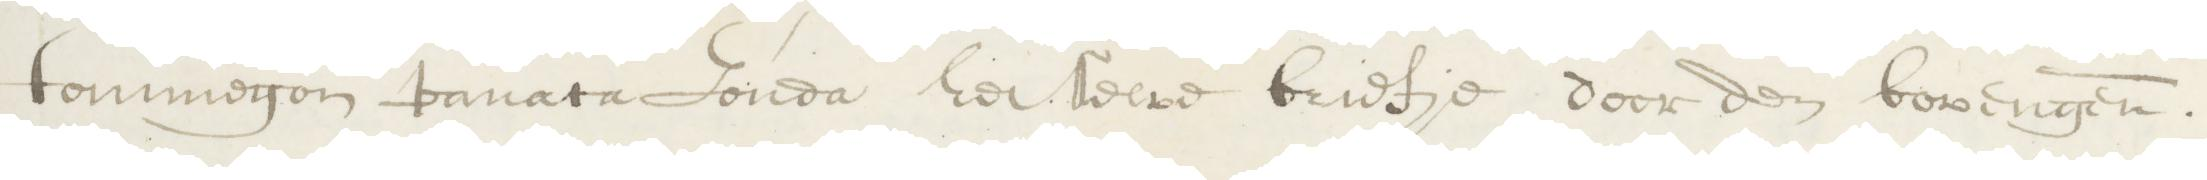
tommegon panata Iouda het selve briefje door den bovengen.
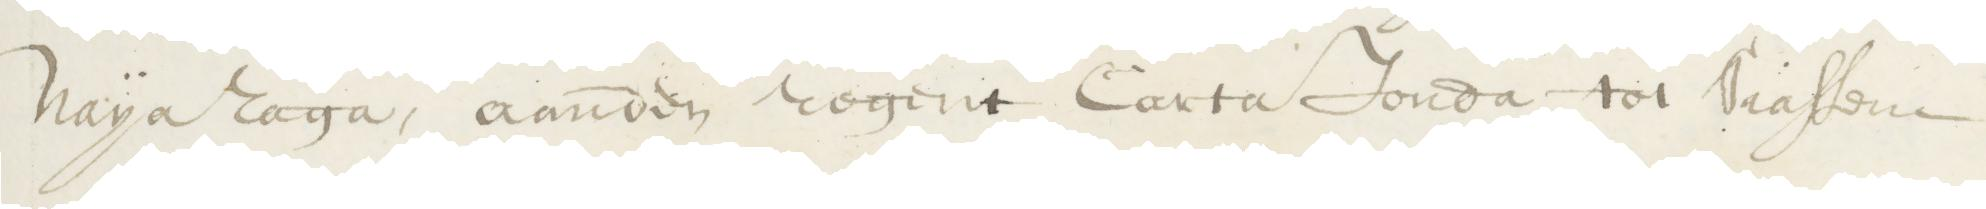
Naija Raga, aanden regent Carta Iouda tot siassem
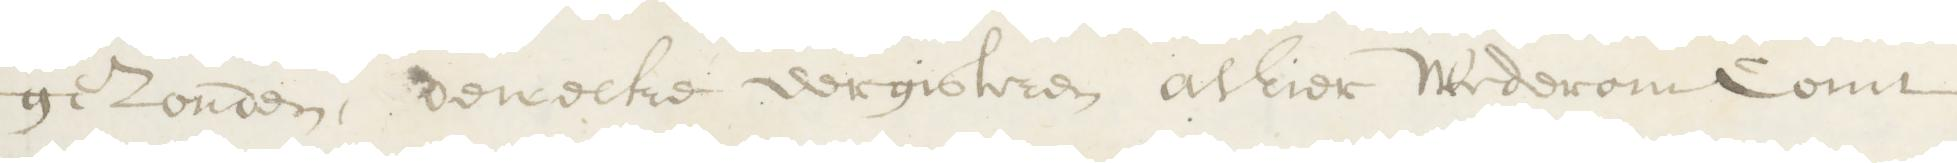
gezonden, dewelke eergisteren alhier wederom comt
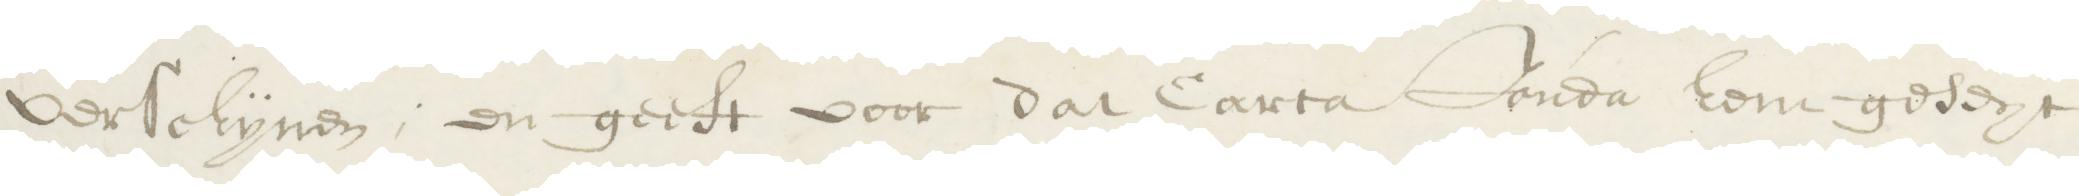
verschijnen; en geeft voor dat Carta Iouda hem geseijt
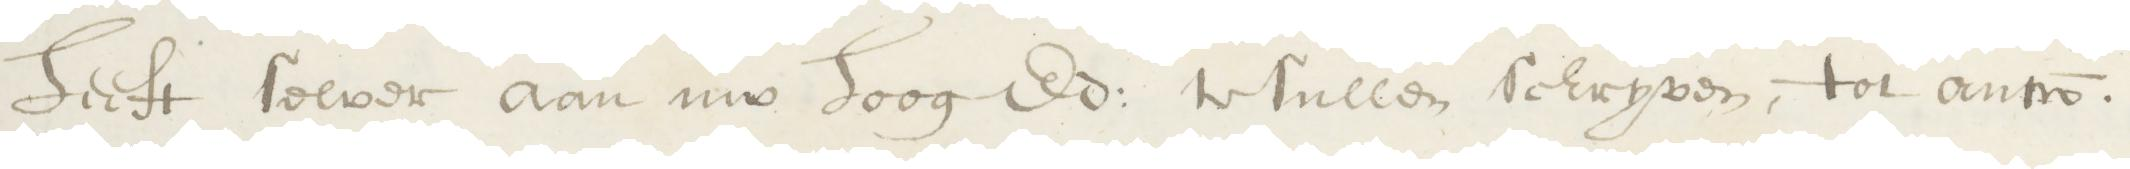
heeft selver aan uw Hoog Ed: te sullen schrijven, tot antw.
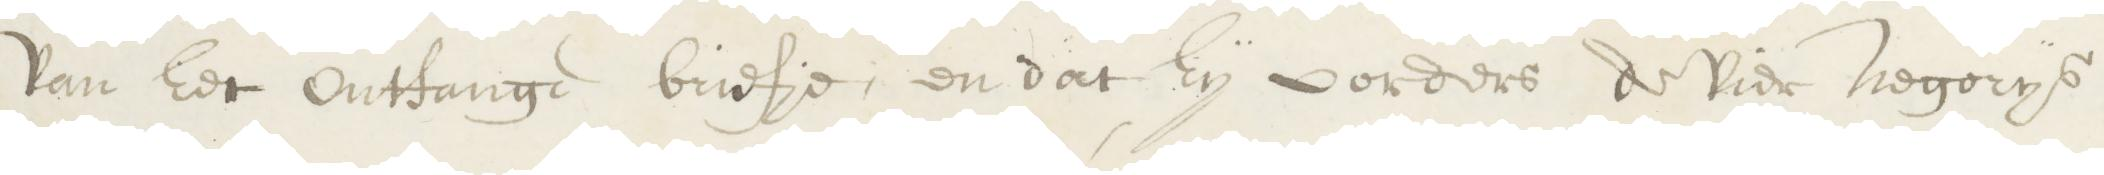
van het ontfange briefje, en dat hij vorders de vier negorijs
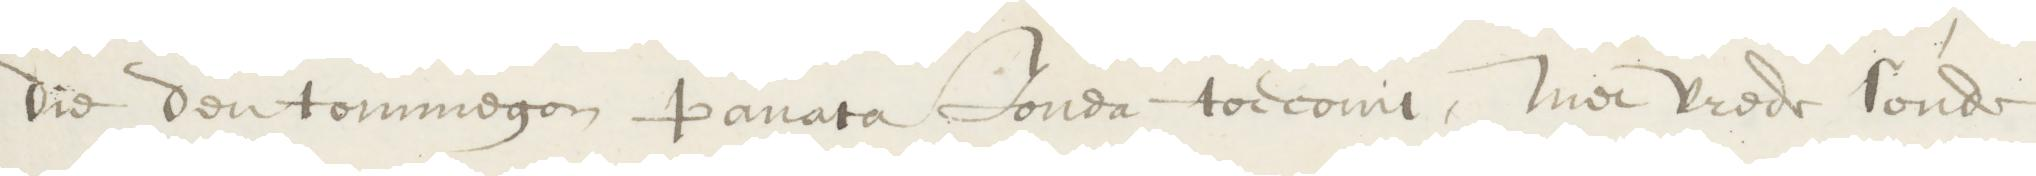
die den tommegon panata Iouda toecomt, met vrede soude
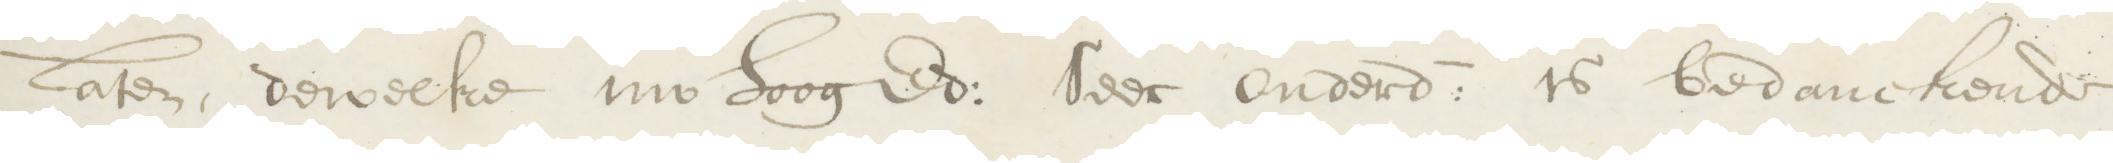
laten, dewelke uw hoog Ed: seer onderd: is bedanckende
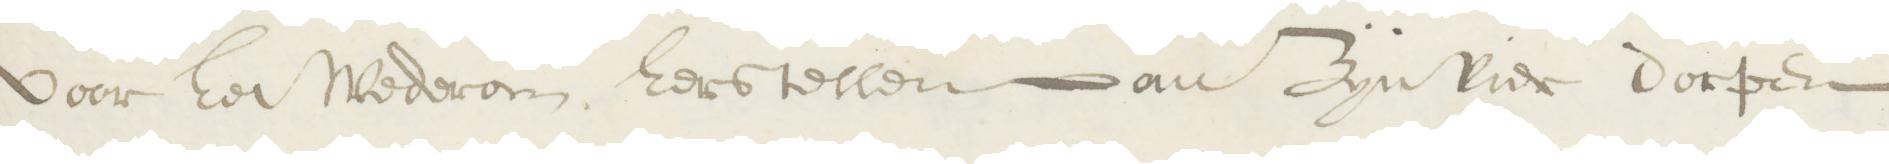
voor het wederom herstellen van zijn vier dorpen
